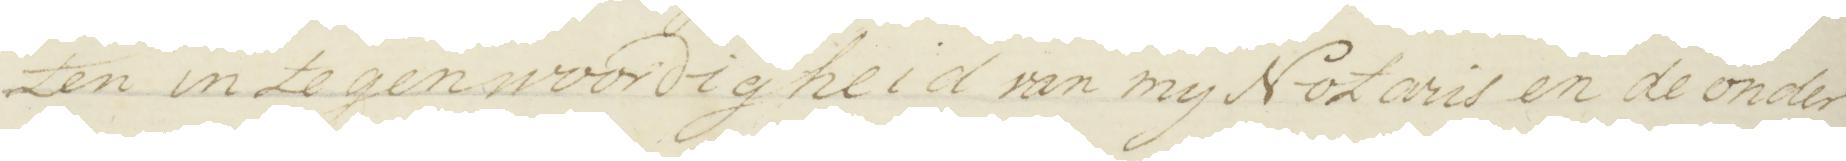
ten in tegenwoordigheid van my Notaris en de onder
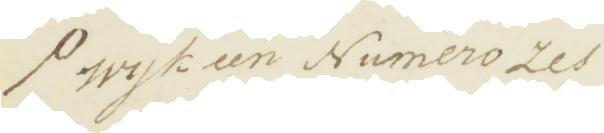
¶ wyk een Numero zes
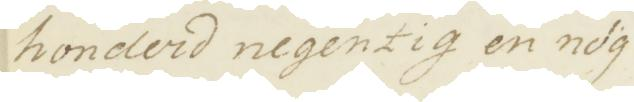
honderd negentig en nog
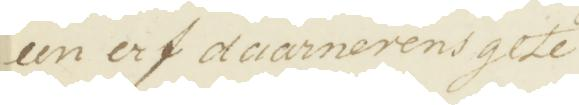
een erf daarnevens gete
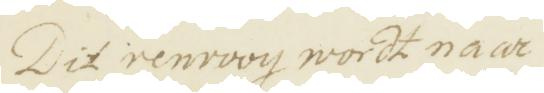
Dit renvooy wordt naar
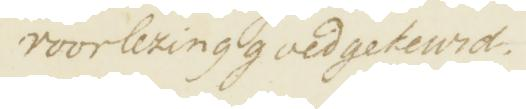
voorlezing goedgekeurd.
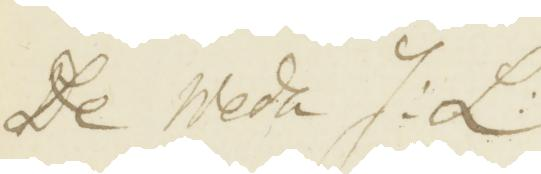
De wedu J: L:
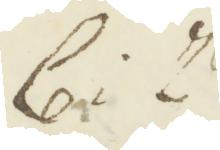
C: Z
